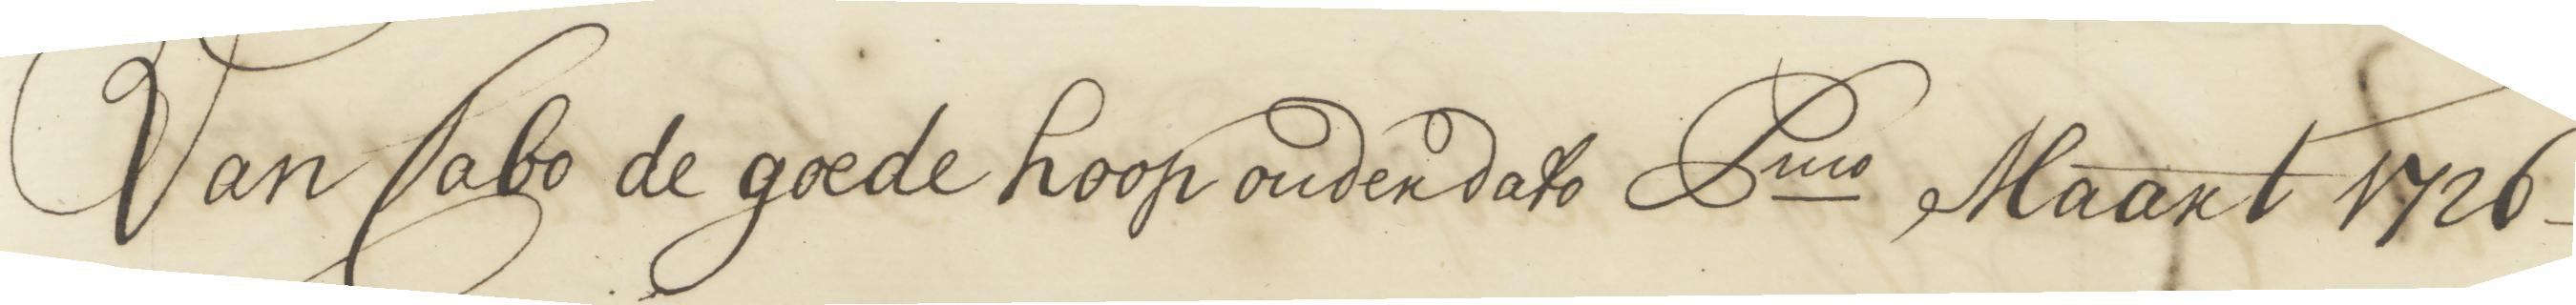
Van Cabo de goede hoop onder dato P-mo Maart 1726
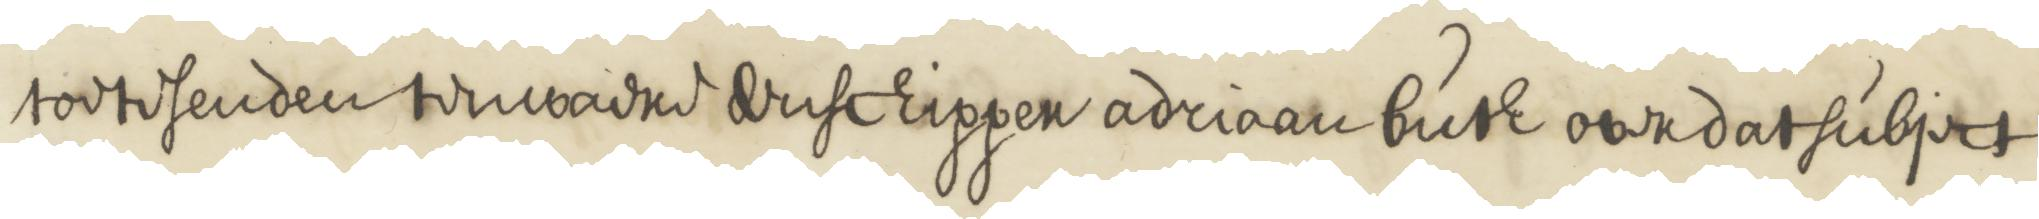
toetesenden ten waere den schipper adriaan buth over dat subject
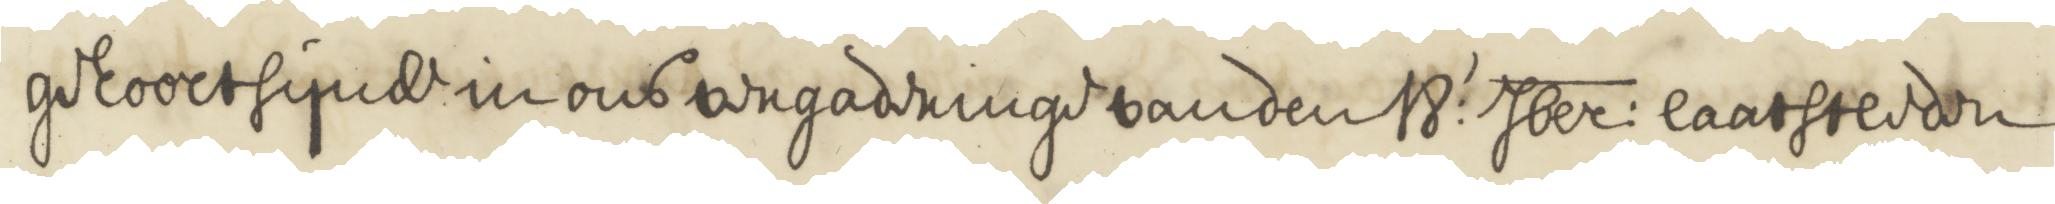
gehoort sijnde in ons vergaderinge van den 18:' 7ber: laatstleden
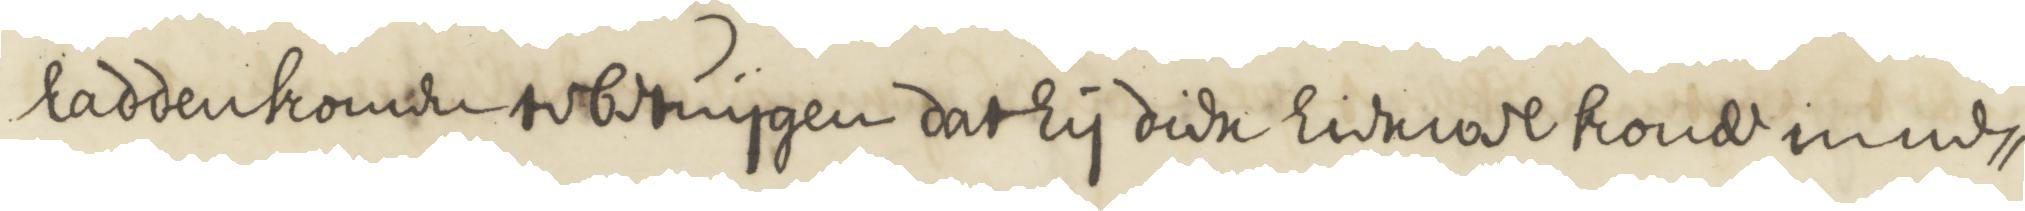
hadden komen te betuijgen dat hij dier hier wel konde inne„
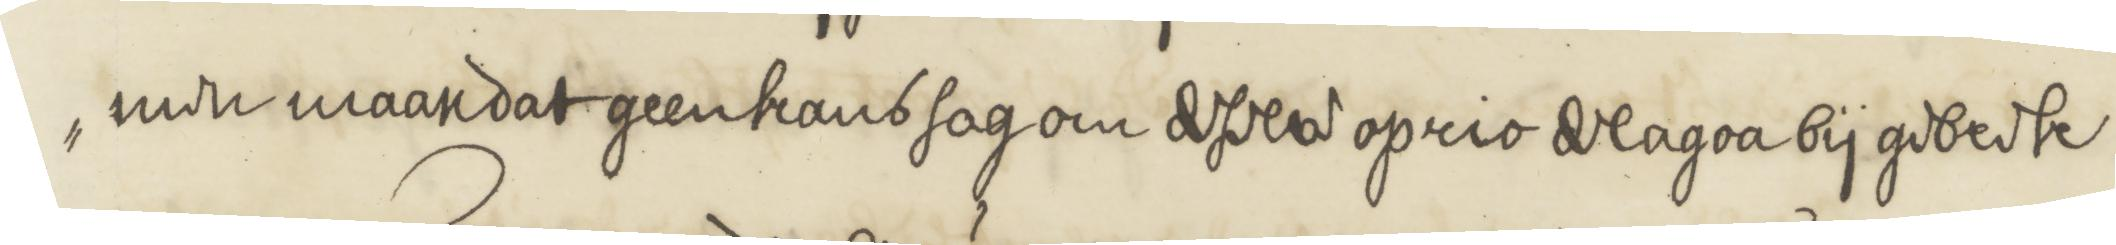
„men maar dat geen kans sag om deselve op rio delagoa bij gebrek
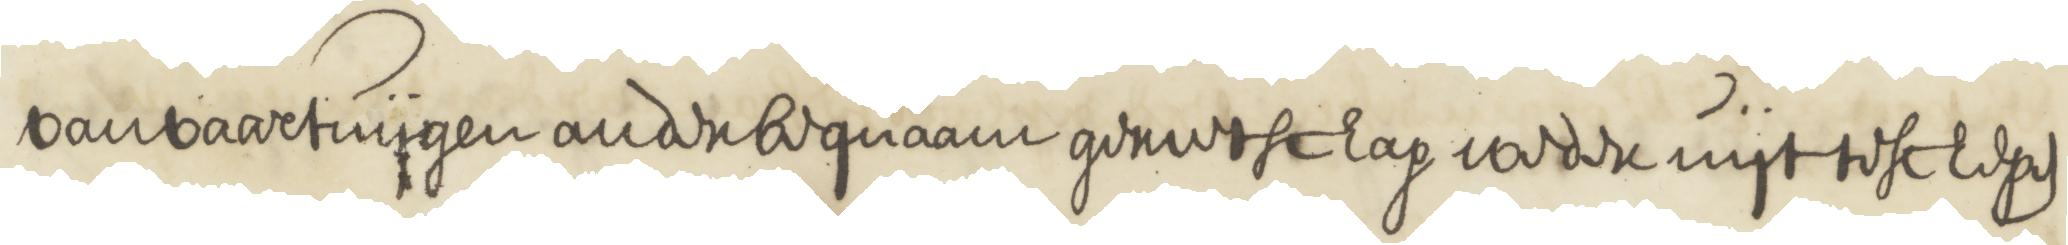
van vaartuijgen ander bequaam gereetschap weder uijt te schepen
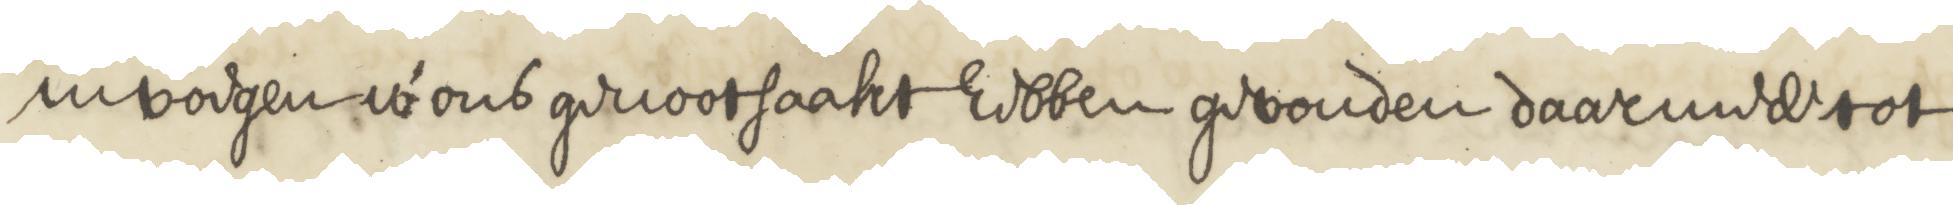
invoegen w'ons genootsaakt hebben gevonden daarmede tot
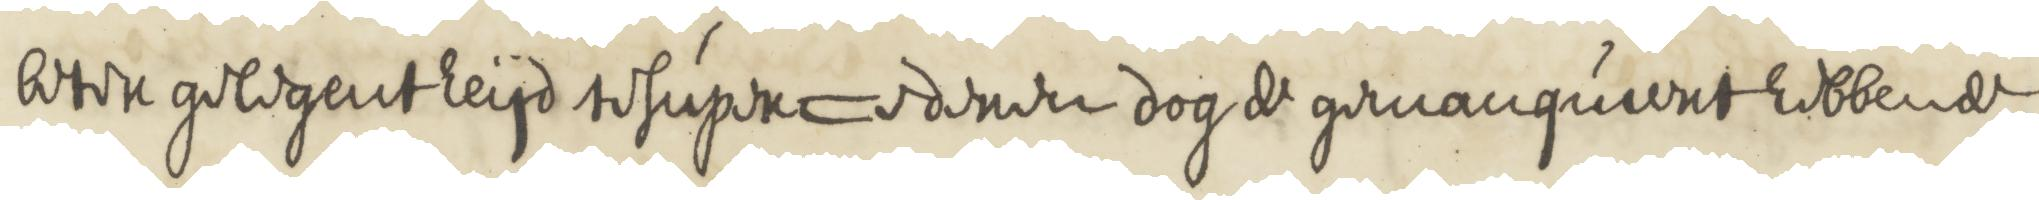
beter gelegentheijd te supercederen dog de gemanqueert hebbende
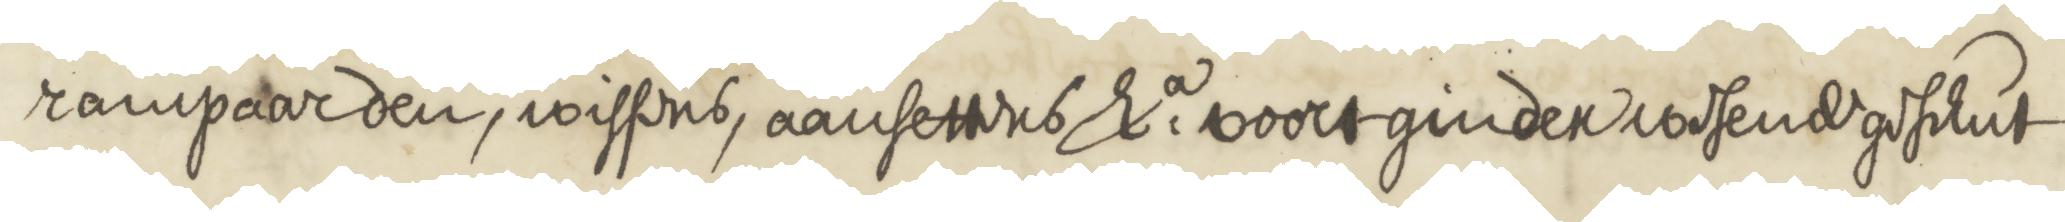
rampaarden, wissers, aansetters &:a voort ginder wesende geschut
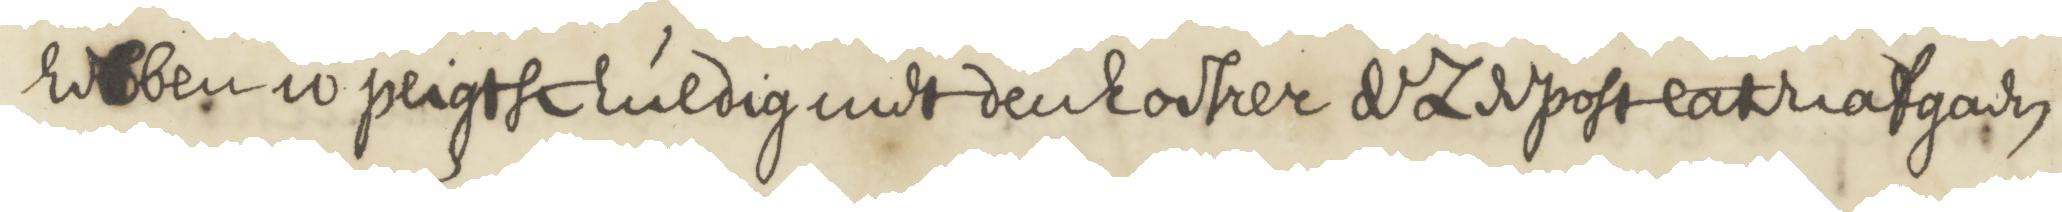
hebben w' pligtschuldig met den hoeker de zeepost laten afgaen
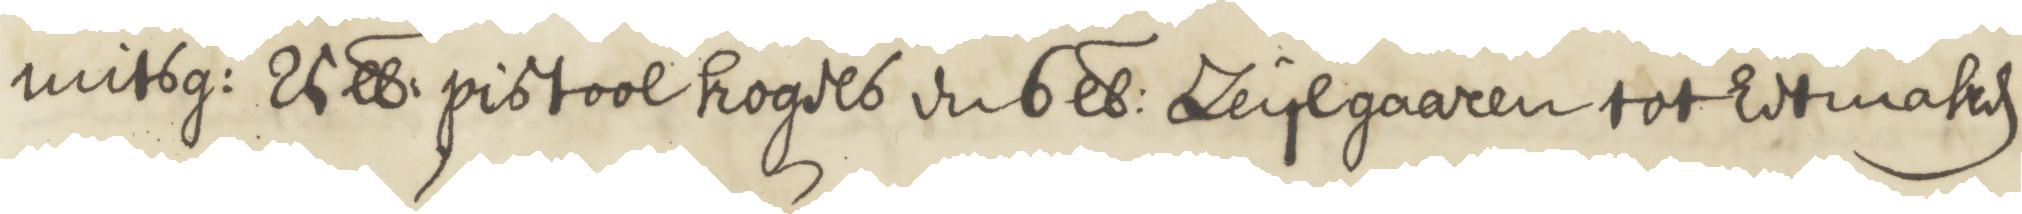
mitsg:s 25 lb: pistool kogels en 6 lb: zeijlgaaren tot het maken
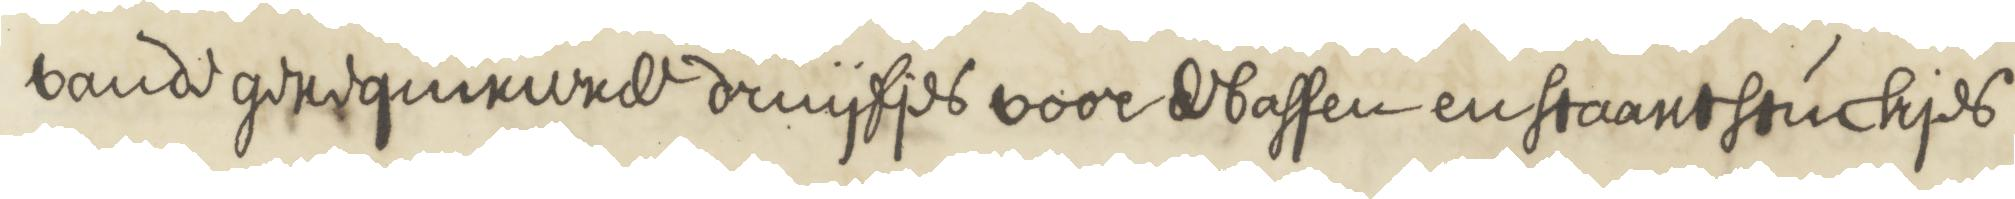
vande gerequireerde druijfjes voor de bassen en staartstuckjes
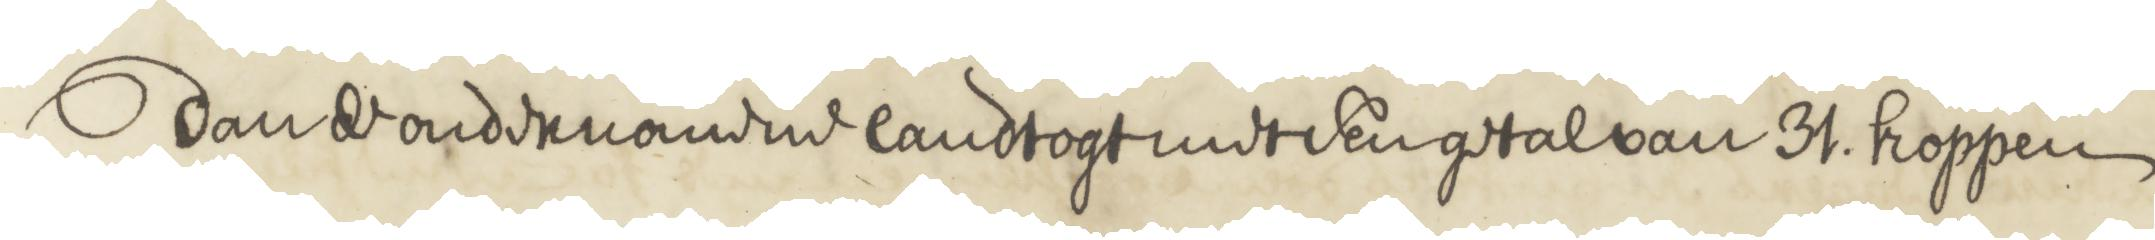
dan de ondernomene landtogt met Een getal van 31. koppen
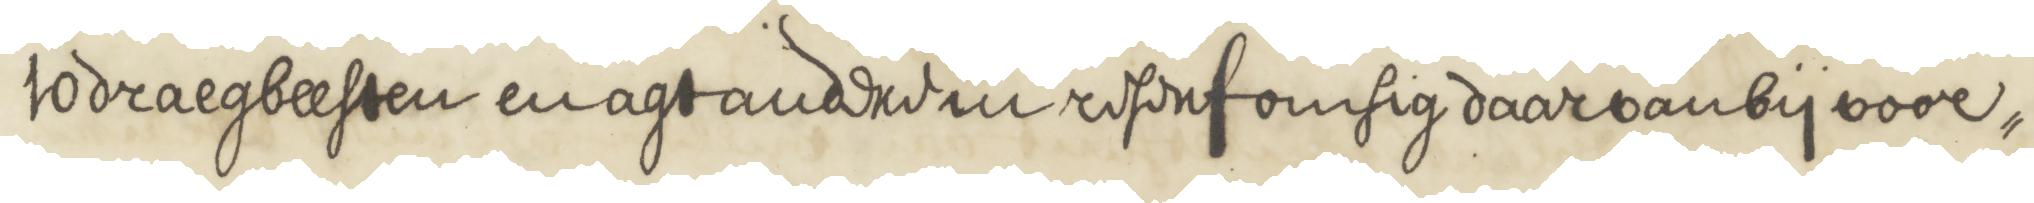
10 draegbeesten en agt andere in reserf om sig daar van bij voor„
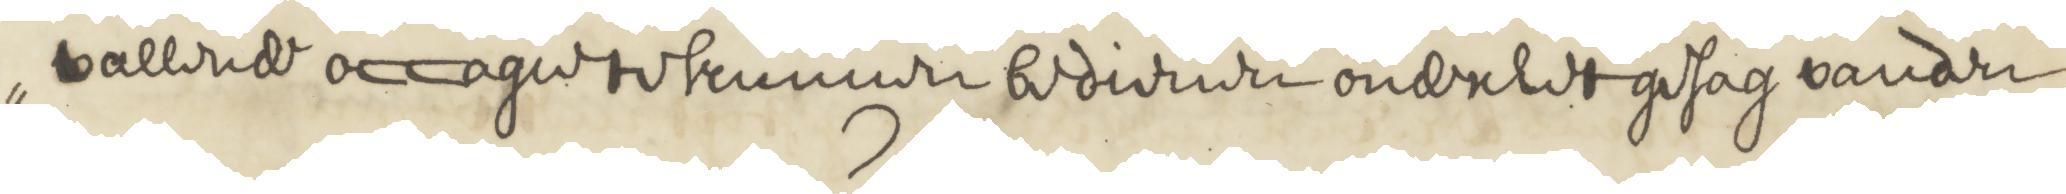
„vallende occagie te kunnen bedienen onder het gesag vanden
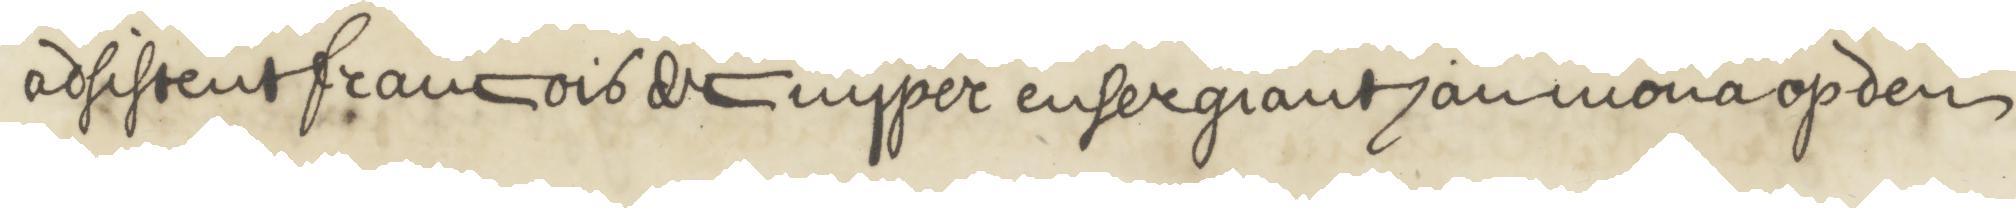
adsistent francois de cuijper en sergiant jan mona op den
